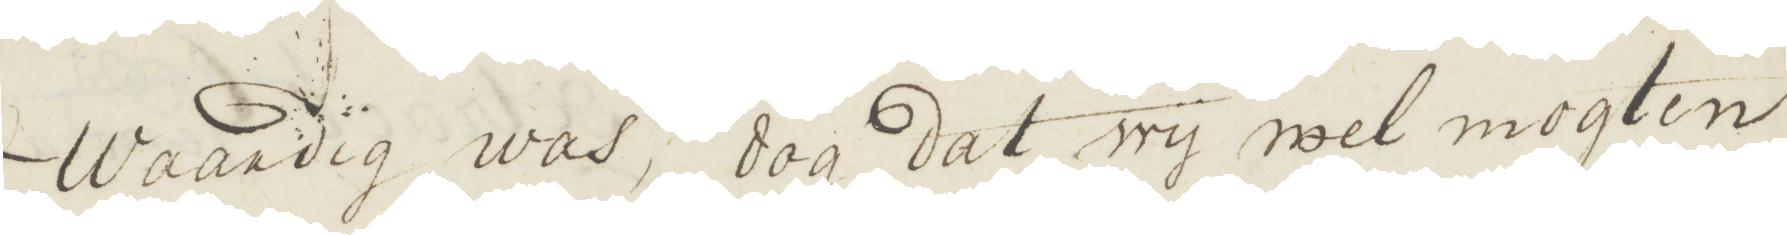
waardig was, dog dat wij wel mogten
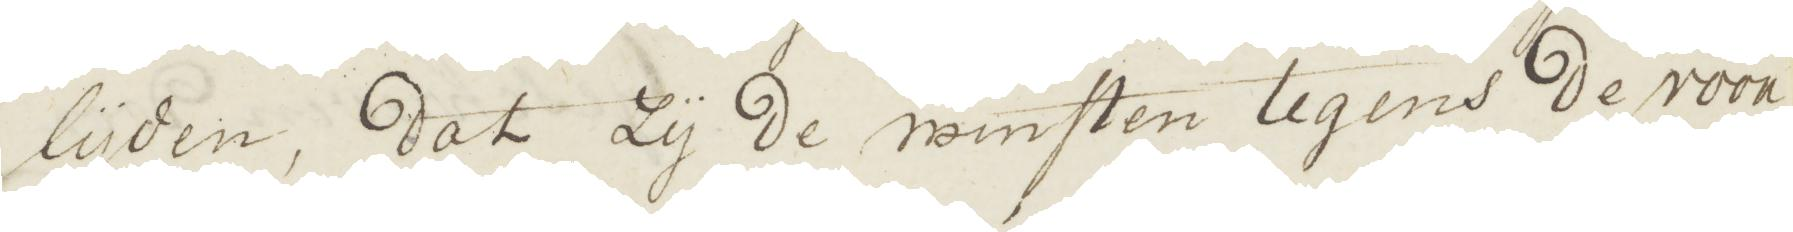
lijden, dat zij de winsten tegens de voor
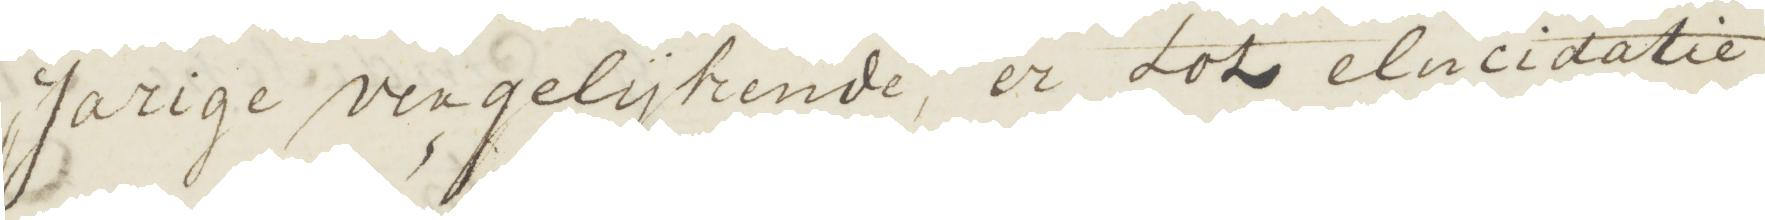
„jarige vergelijkende, er tot elucidatie
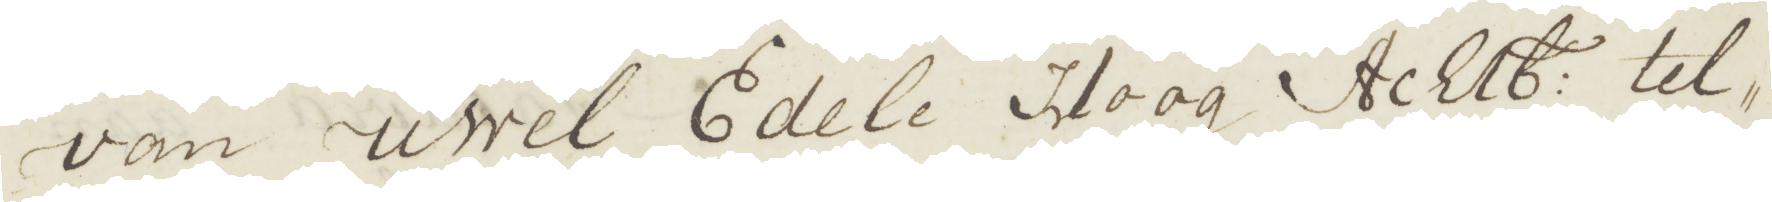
van uwel Edele Hoog Achtb: tel„
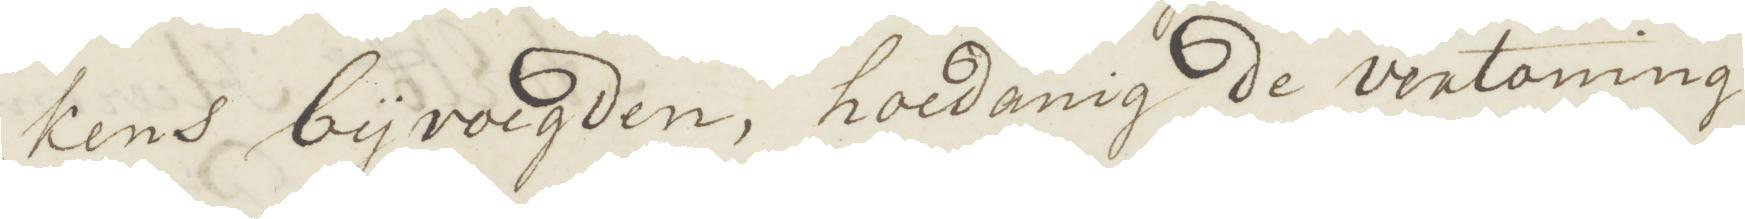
kens bij voegden, hoedanig de vertoning
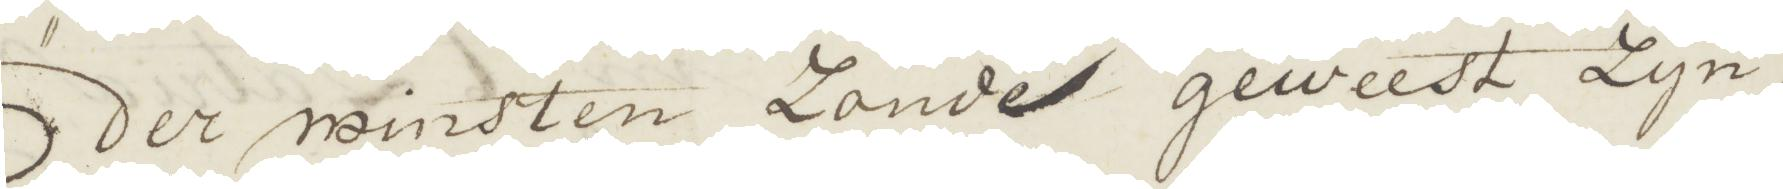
der winsten zoude geweest zijn,
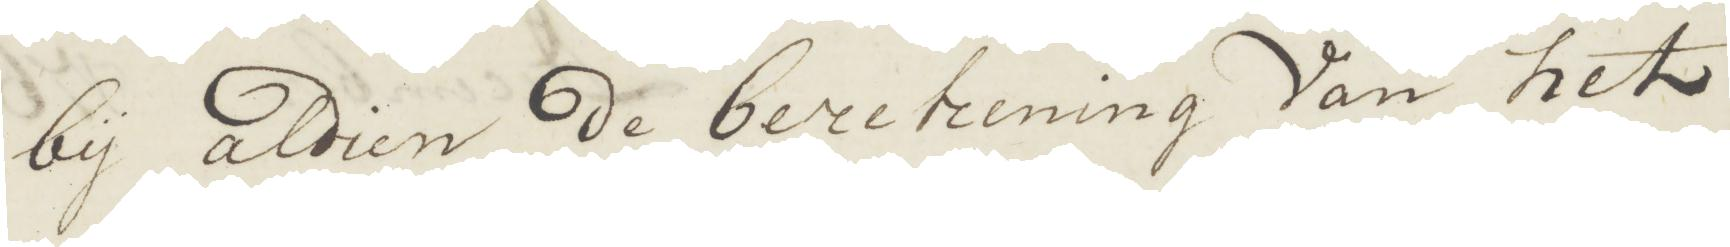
bij aldien de berekening van het
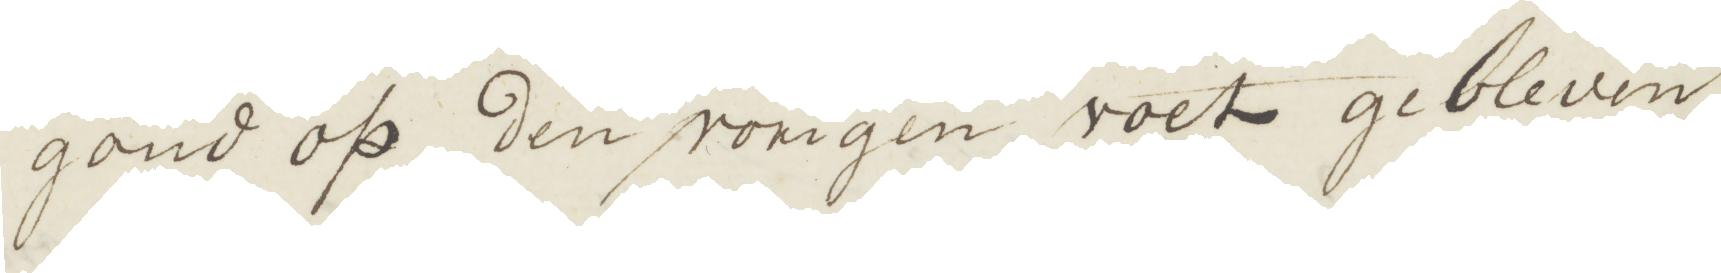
goud op den vorigen voet gebleven
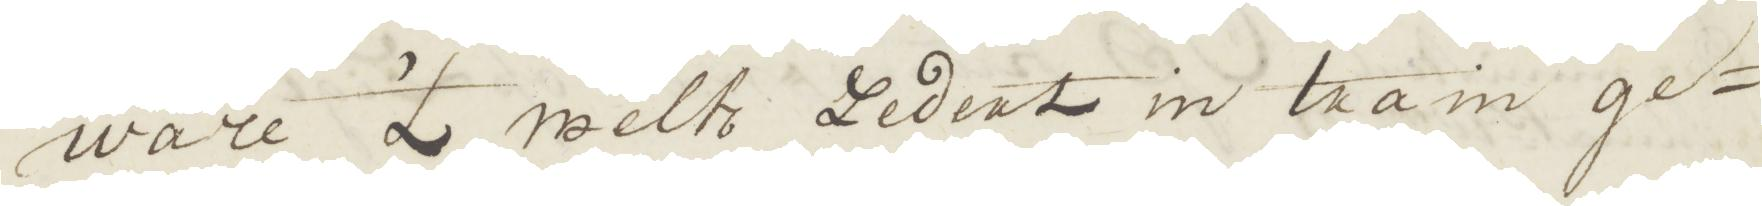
ware 't welk zedert in train ge=
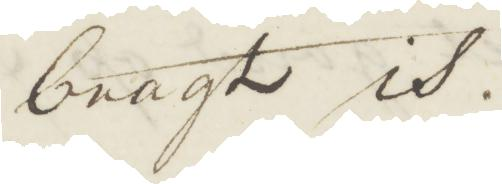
bragt is.
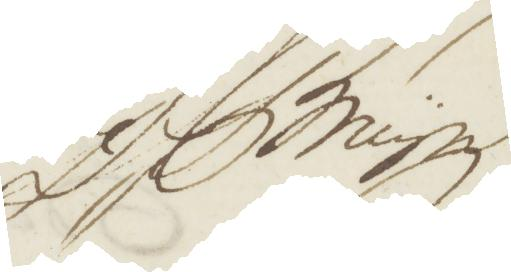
J„D„Bruijn
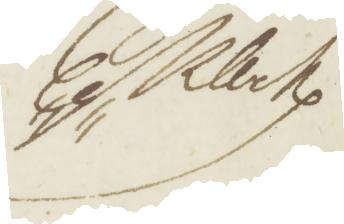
E„g„ klerk
